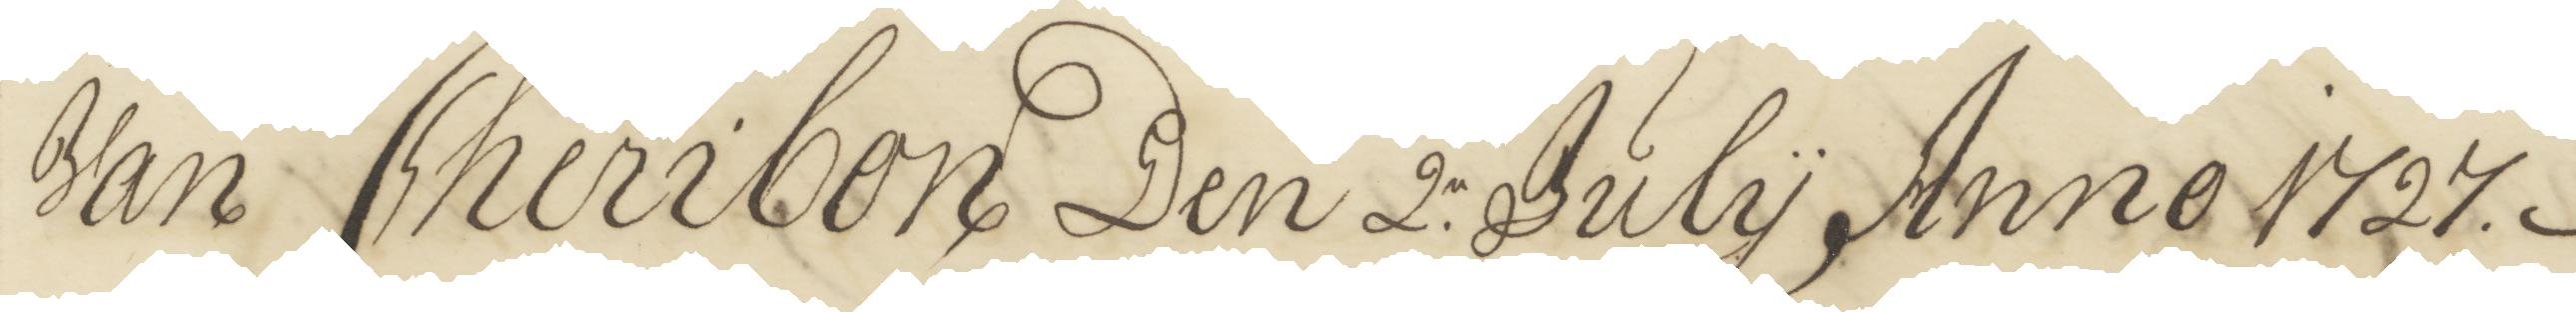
Van Cheribon Den 2:n Iulij Anno 1727. —
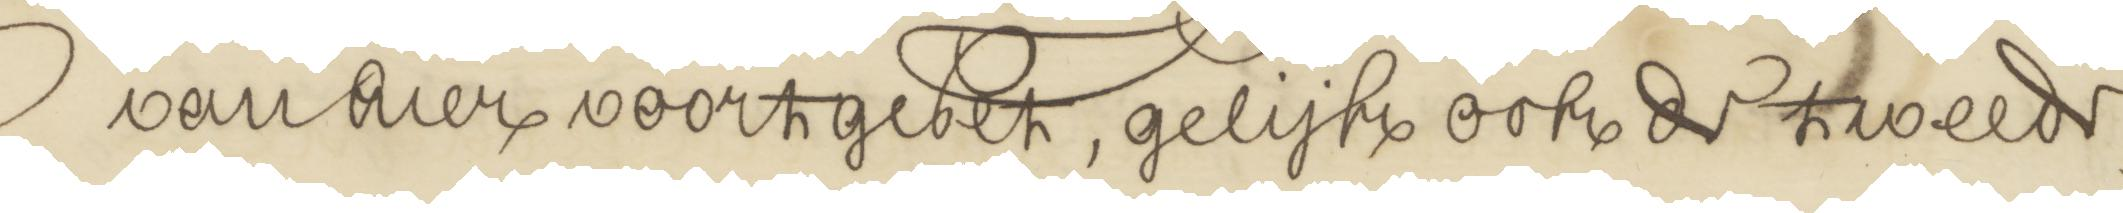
van hier voort geset, gelijk ook de tweede
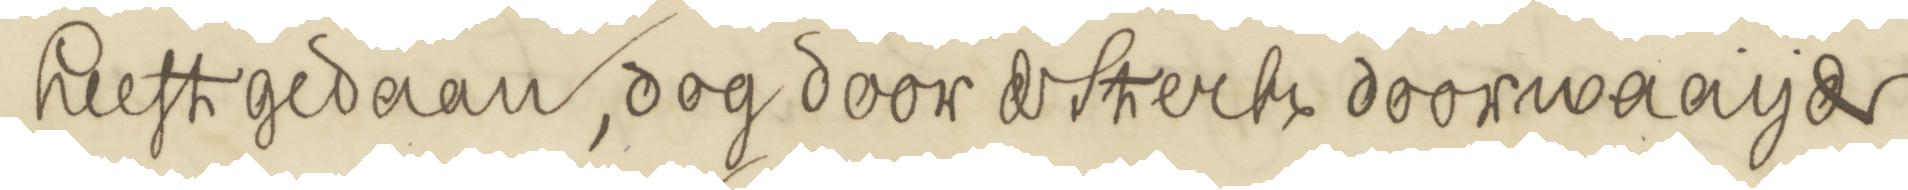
heeft gedaan, dog door de sterk doorwaaijde
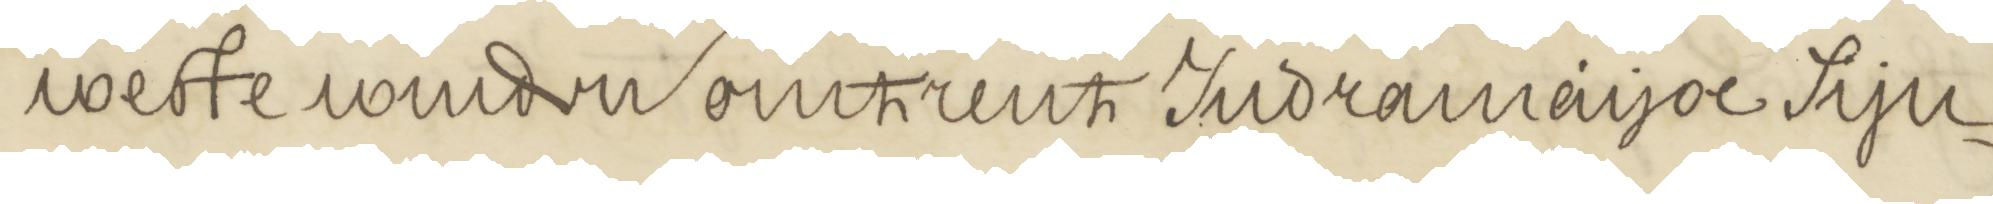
weste winden omtrent Indramaijoe Sijn
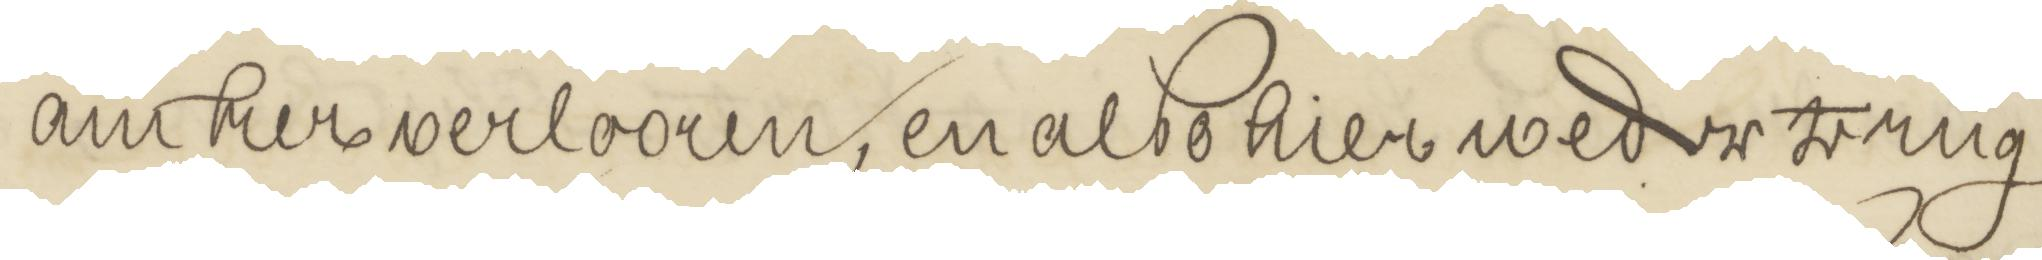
ancker verlooren, en also hier weder terug
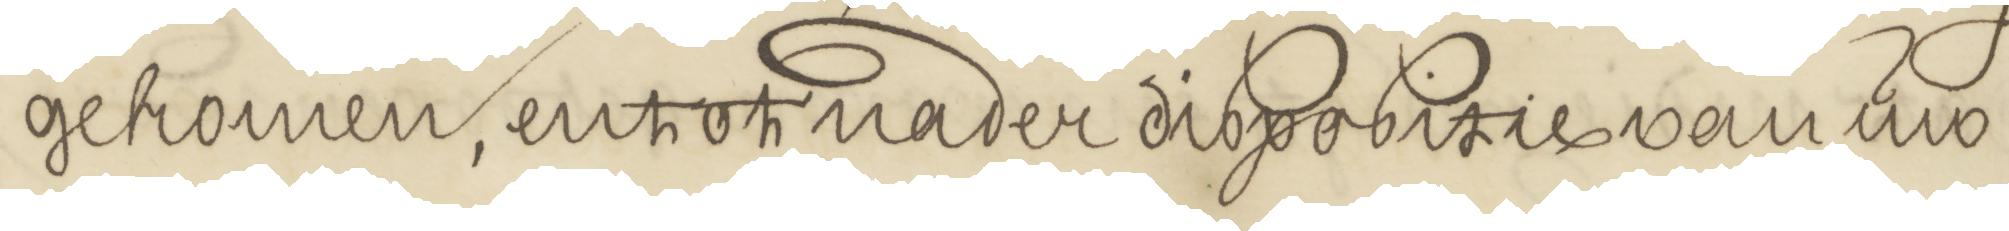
gekomen, en tot nader dispositie van uw
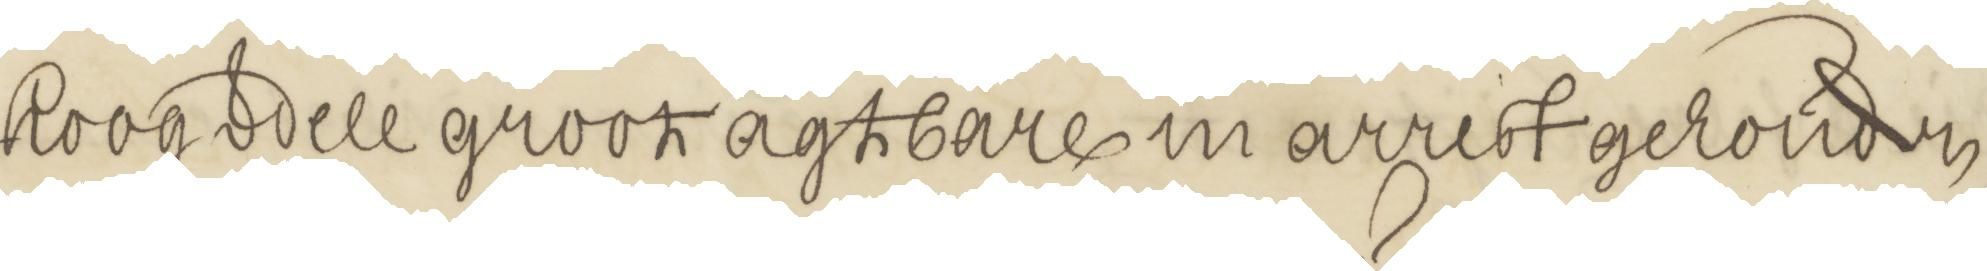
hoog Edele groot agtbare in arrest gehouden,
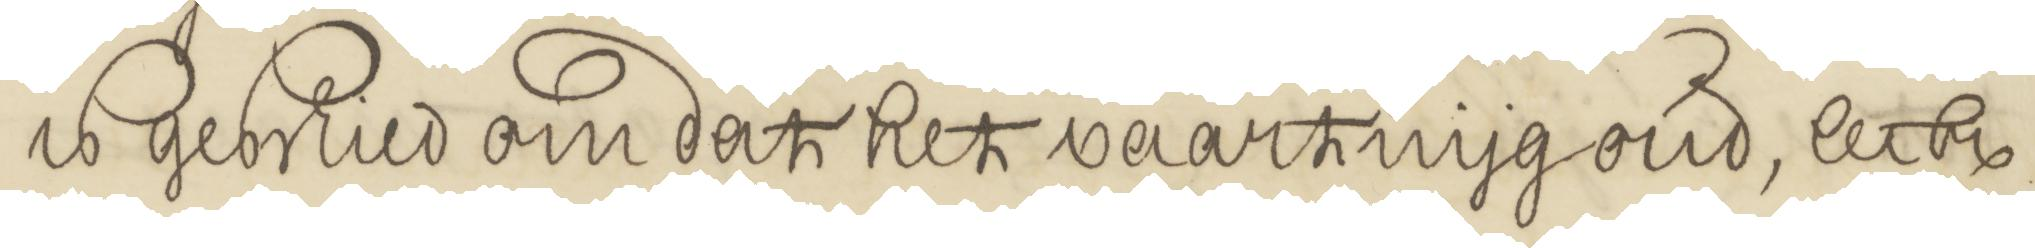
is geschied om dat het vaartuijg oud, leck
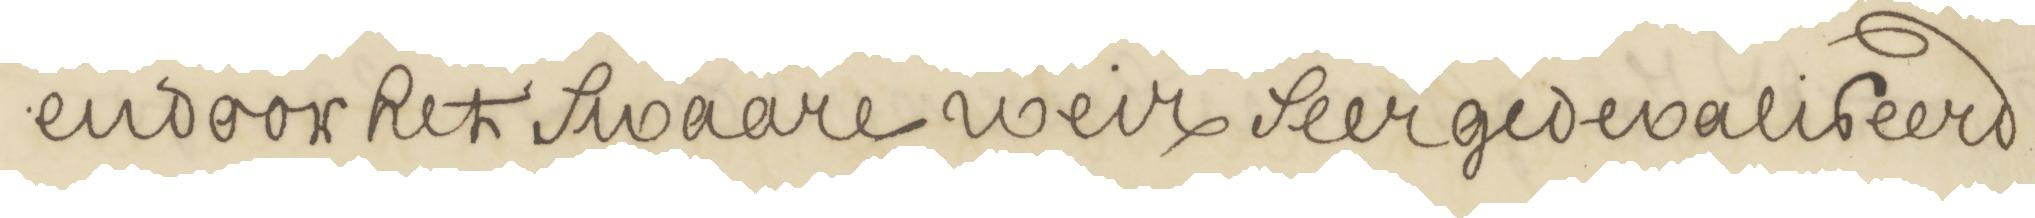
en door het swaare weir seer gedevaliseerd
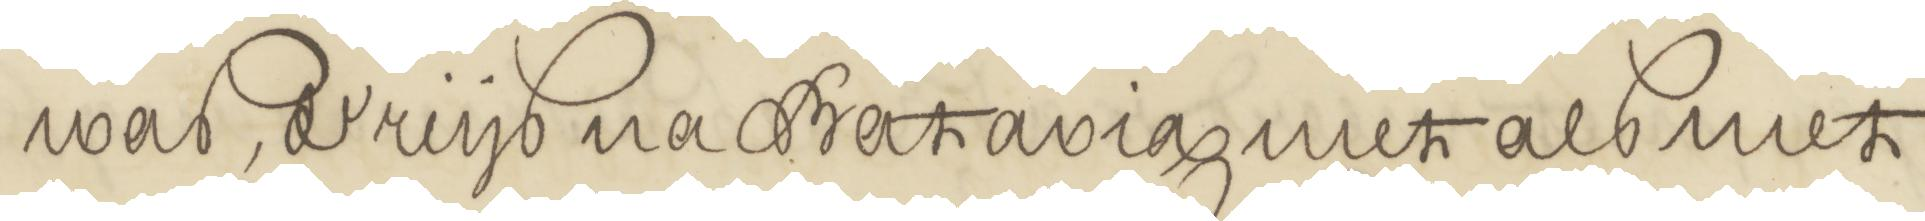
was, de reijs na Batavia niet als met
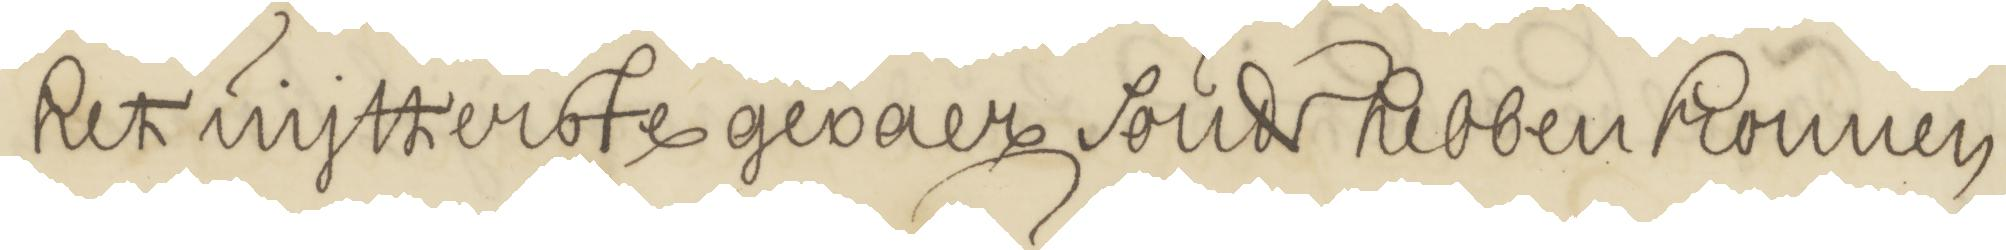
het uijtterste gevaer Soude hebben konnen
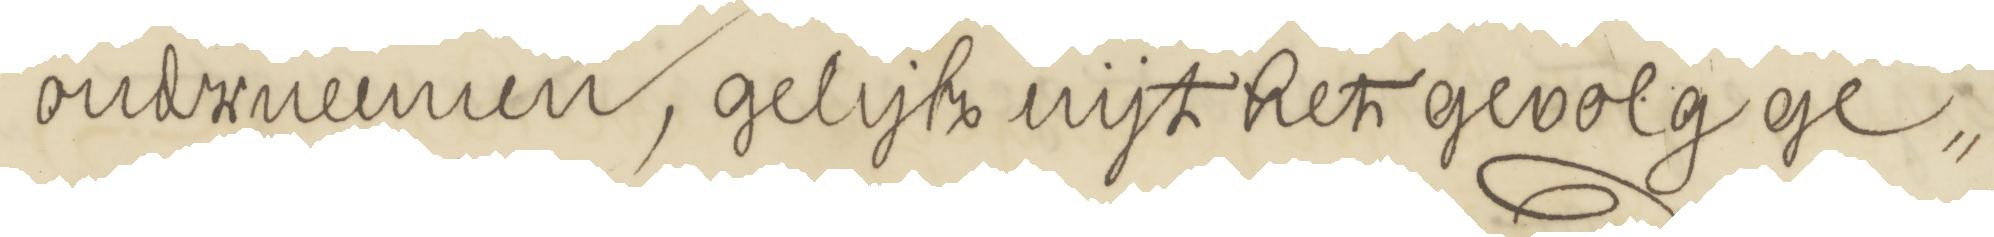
onderneemen, gelijk uijt het gevolg ge„
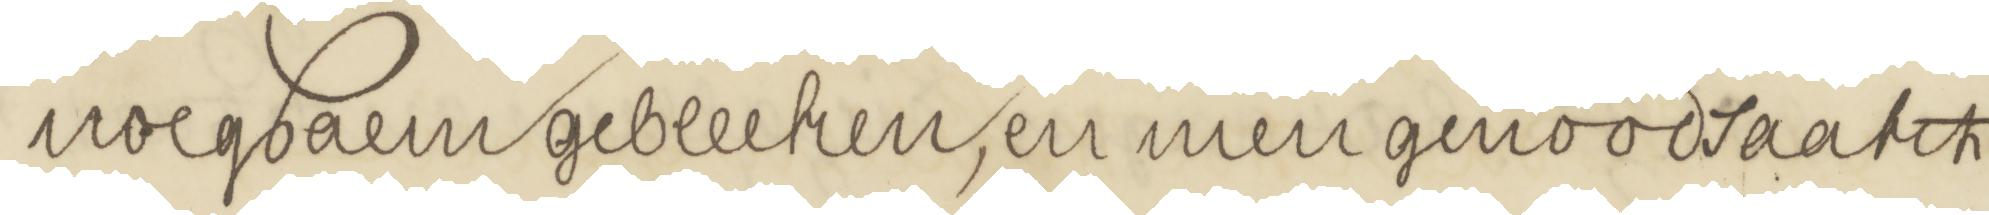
noegsaem gebleeken, en men genoodsaakt
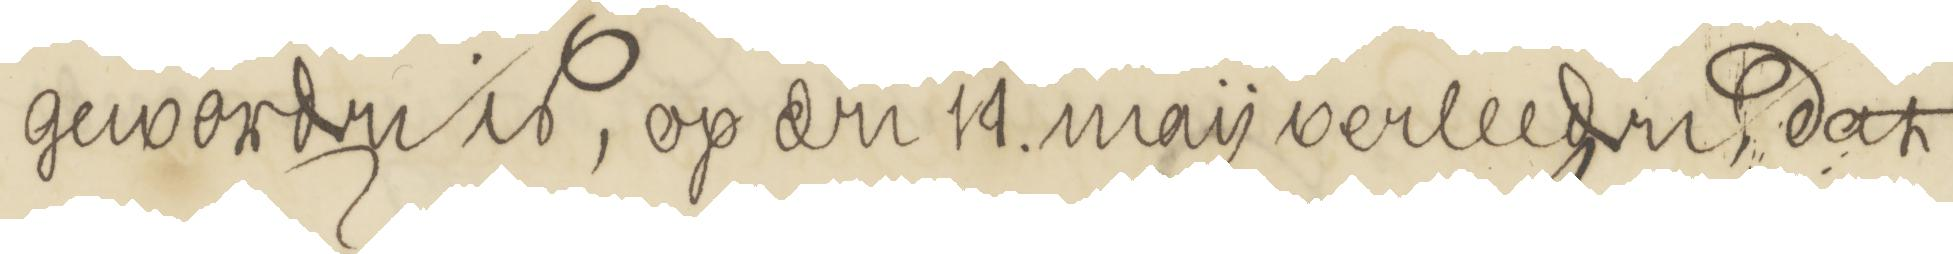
geworden is, op den 14. maij verleeden, dat
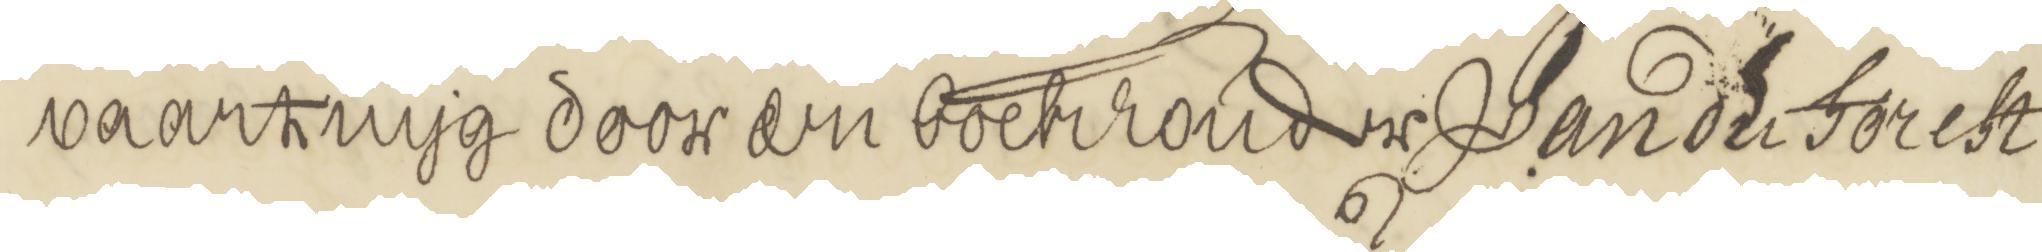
vaartuijg door den boekhouder Jan du Forest
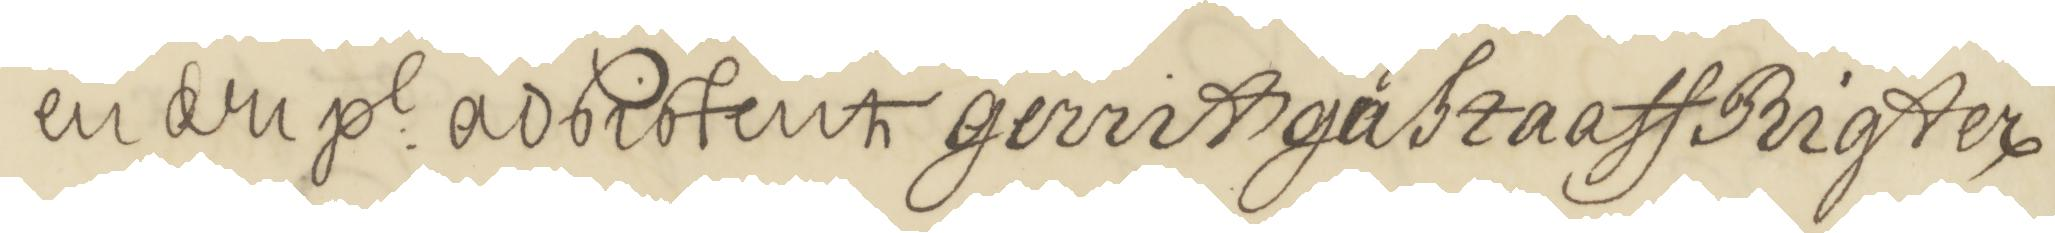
en den p:l adsistent gerrit gustaaff Rigter
